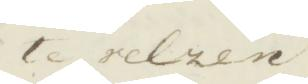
te velzen
